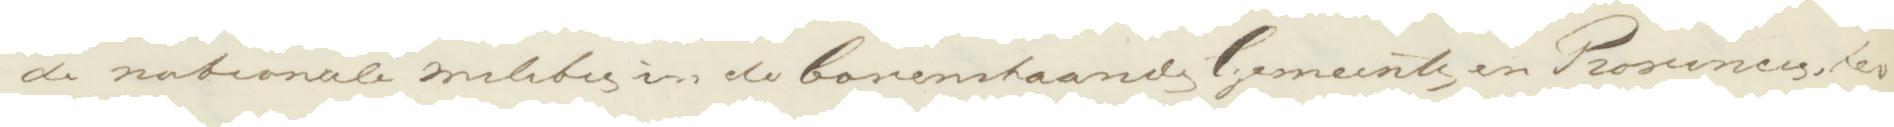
de nationale militie in de bovenstaande Gemeente en Provincie, ter
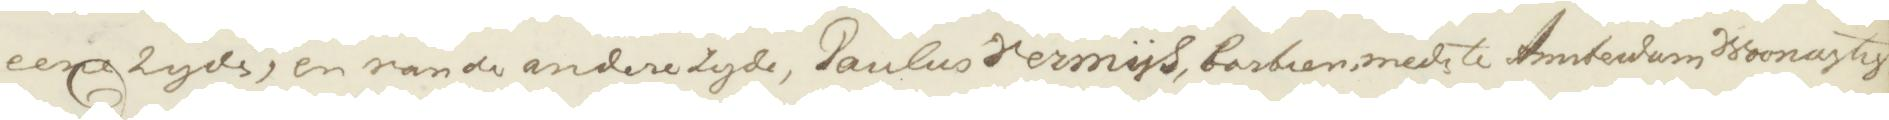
eene zyde, en van de andere zyde, Paulus Vermijs, barbier, mede te Amsterdam woonagtig
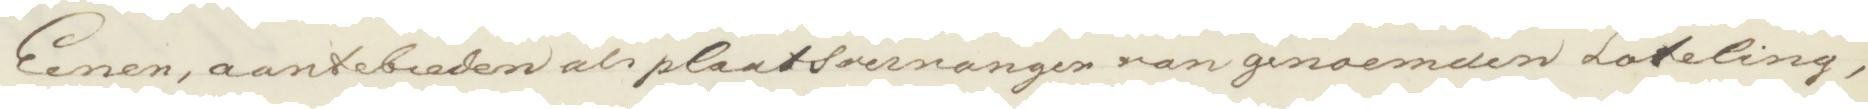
Eenen, aantebieden als plaatsvervanger van genoemden Loteling
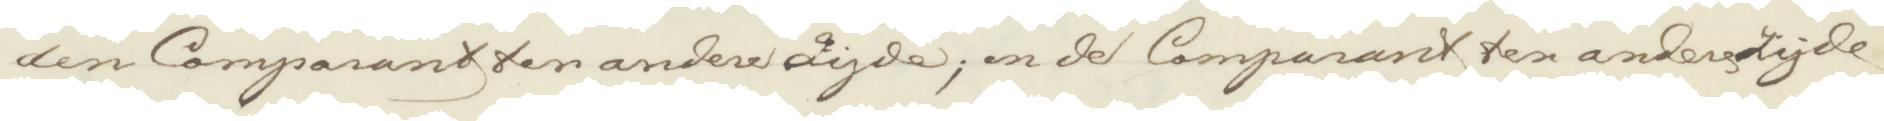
den Comparant ter andere zijde; en de Comparant ter andere zijde
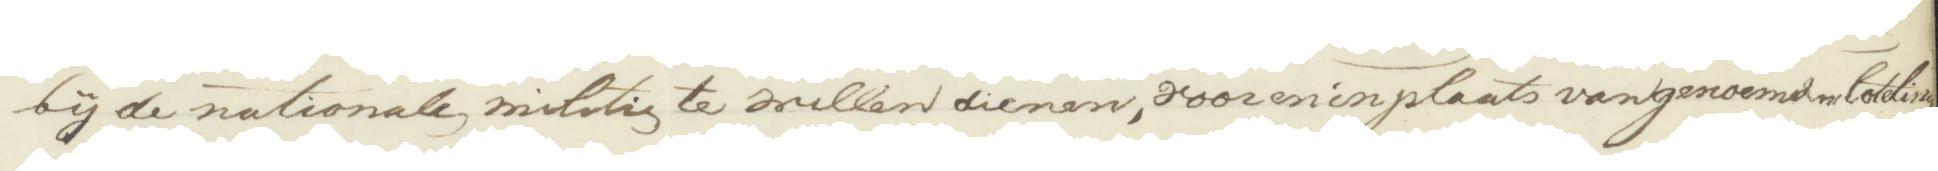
bij de nationale militie te willen dienen, voor en in plaats van genoemden loteling
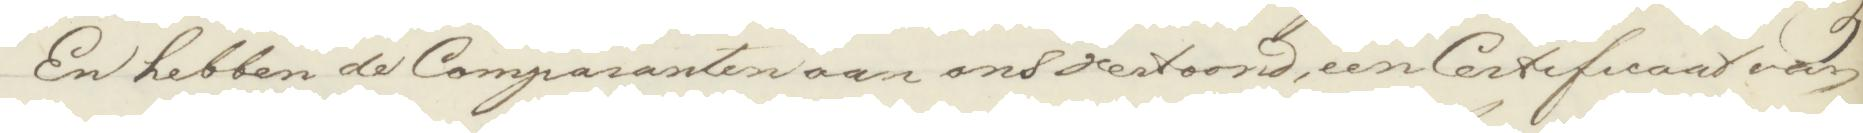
En hebben de Comparanten aan ons vertoond, een Certificaat van
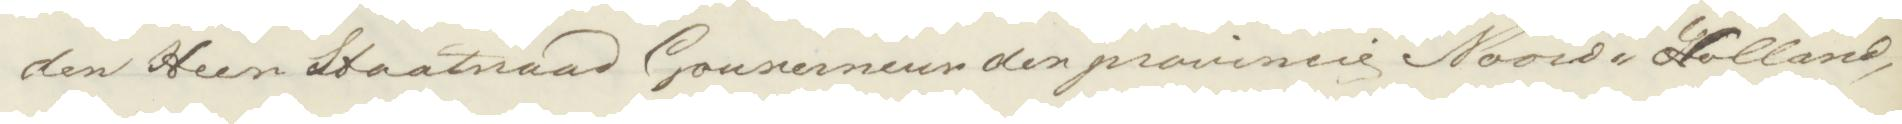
den Heer staatsraad Gouverneur der provincie Noord„ Holland,
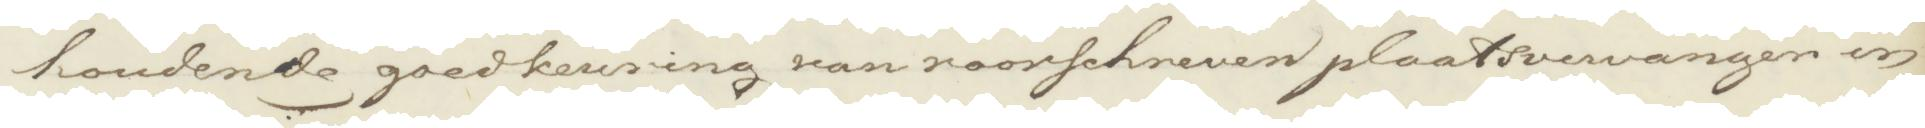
houdende goedkeuring van voorschreven plaatsvervanger en
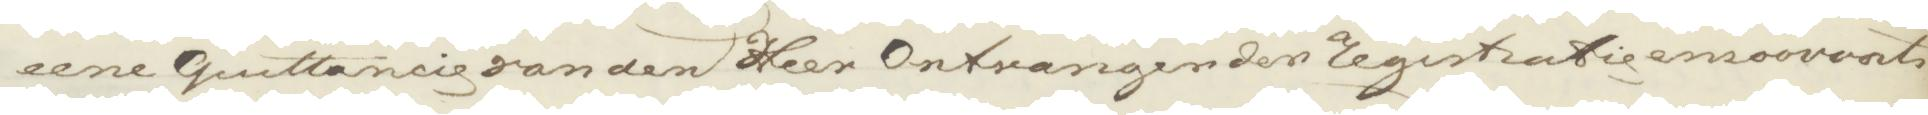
eene quittancie van den Heer Ontvanger der registratie enzoovoorts
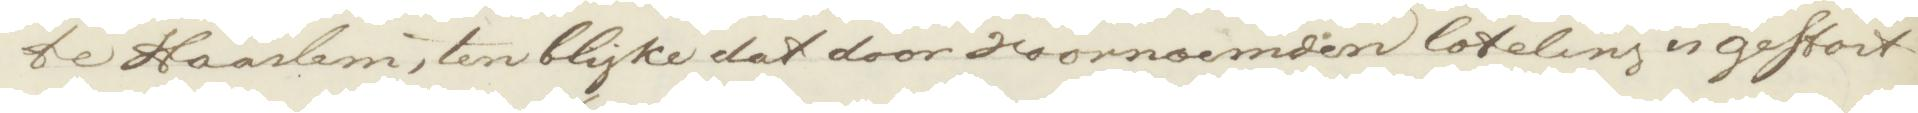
te Haarlem, ten blijke dat door voornoemden loteling is gestort
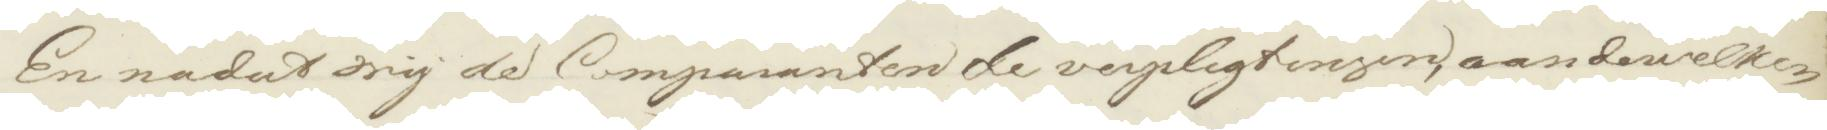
En nadat wij de Comparanten de verpligtingen, aan dewelken
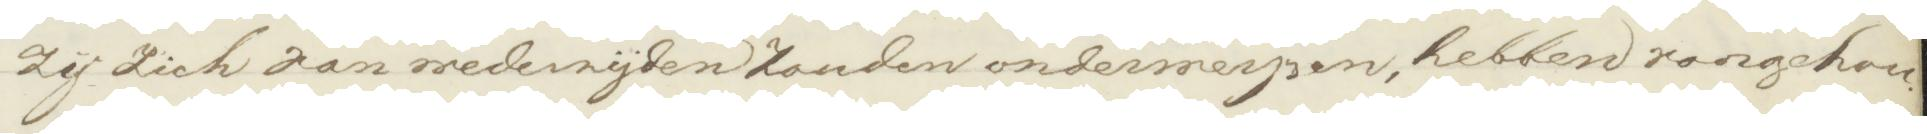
zij zich van wederzijden zouden onderwerpen, hebben voorgehou
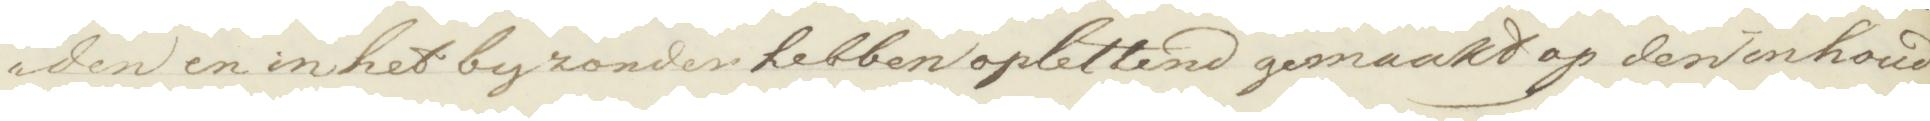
den en in het byzonder hebben oplettend gemaakt op den inhoud
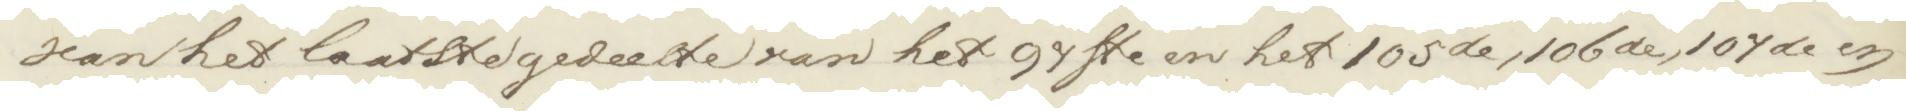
van het laatste gedeelte van het 97ste en het 105de, 106de, 107de en
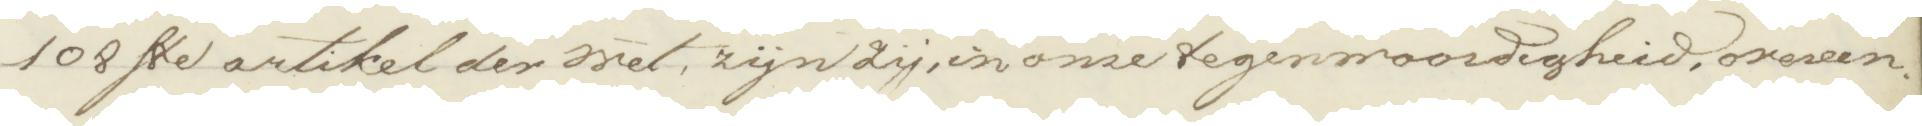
108 ste artikel der wet, zijn zij, in onze tegenwoordigheid, overeen„
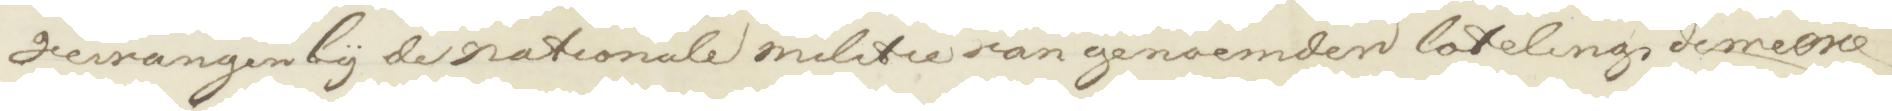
vervangen bij de nationale militie van genoemden loteling, dewelke
